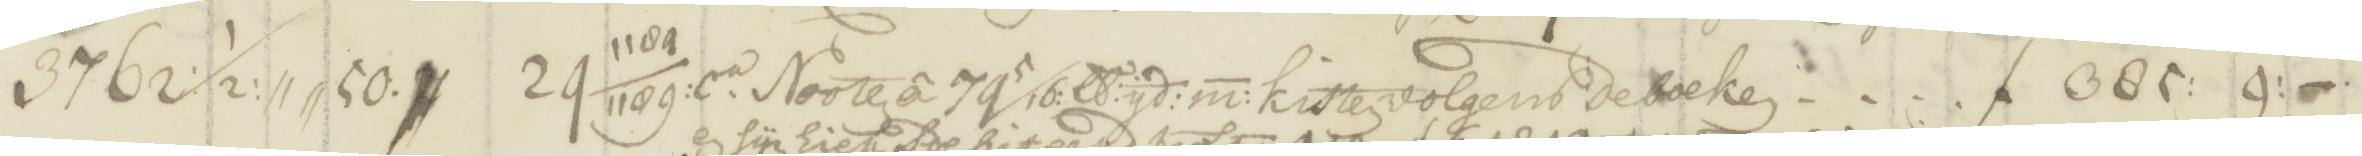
3762: ½: „ „ 50.„ 24 1184/1189: C.a Noote â 74 5/16: lb: ijd: m: kisten volgens de boeken - - - .ƒ 385: 9: —:
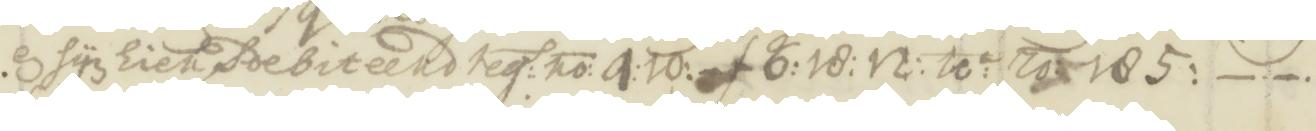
en sijn hier verdebiteerd teg:s ro: 4: 10: - ƒ 6: 18: 12: te:' ro: 185: —. —.
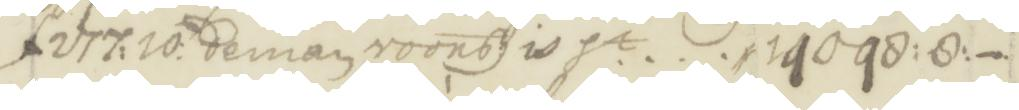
ƒ 277: 10: deman voorsz is s.t . . . „ 14098: 8: —
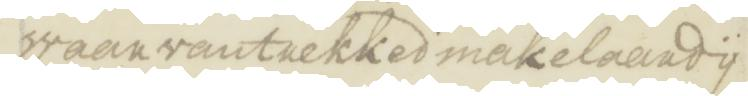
waar vantrekked' makelaardij
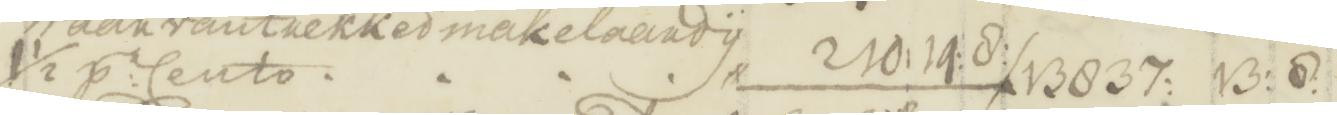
1½ p:r Cento . . . . „ 210: 14: 8: ƒ 13837: 13: 8:
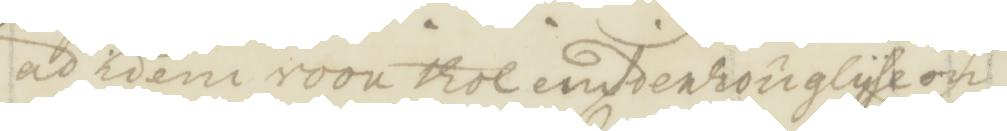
ad idem voor thol en verderhouglijse on
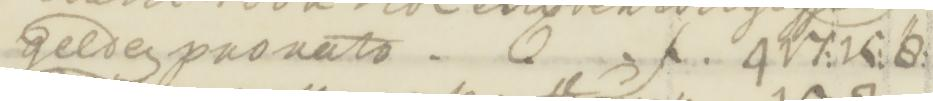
gelden prorato . . . ƒ. 417: 15: 8:
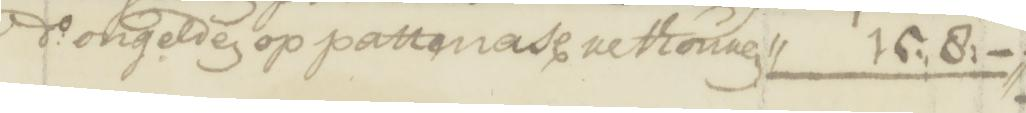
d:o ongelden op pattenase rethouren „ 15: 8: —
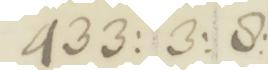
433: 3: 8:
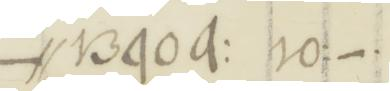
„ 13404: 10: —.
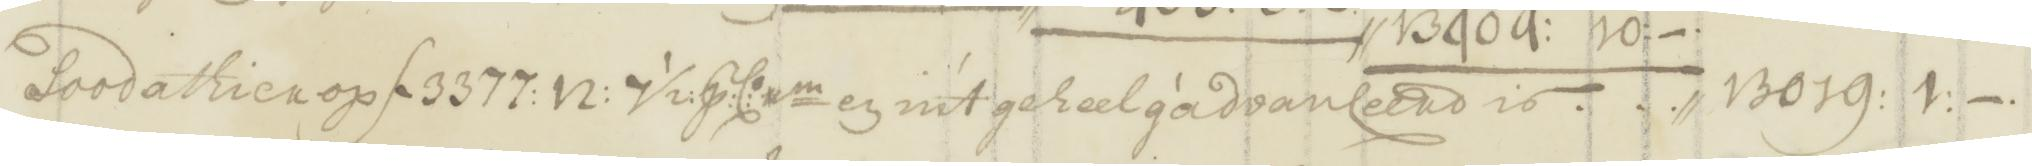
soo dat hier op ƒ 3377: 12: 7½: p:rC:o r=m en in't geheel g'advanceerd is . . .„ 13019: 1: —.
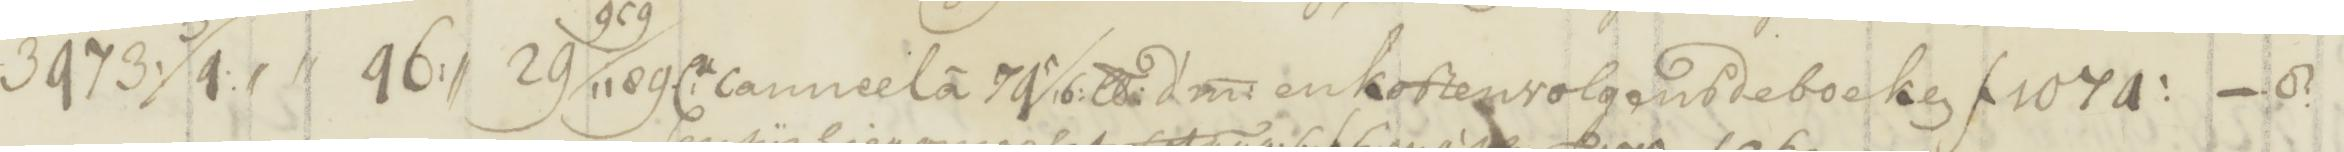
3473: 3/4: „ „ 46: „ 29 959/1189: C:r canneel â 74 5/16: lb: d' m: en kosten volgens de boeken ƒ 1074: —. 8:
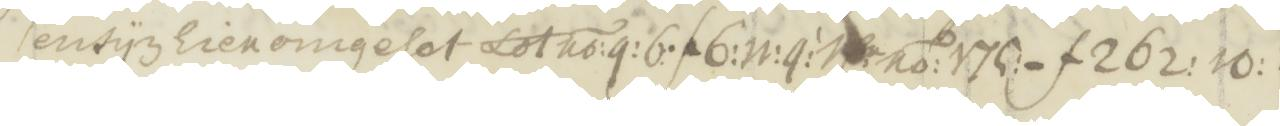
en sijn hier omgeset tot ro: 4: 6: ƒ 6: 11: 4: 't C:r ro:s 175: — ƒ 262: 10:
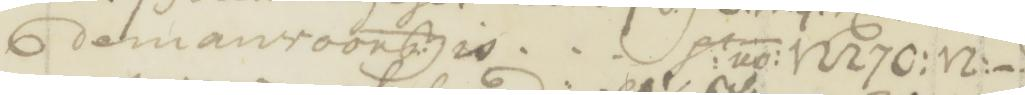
demanvoorsz: is . . - s:t ro: 12270: 12: —
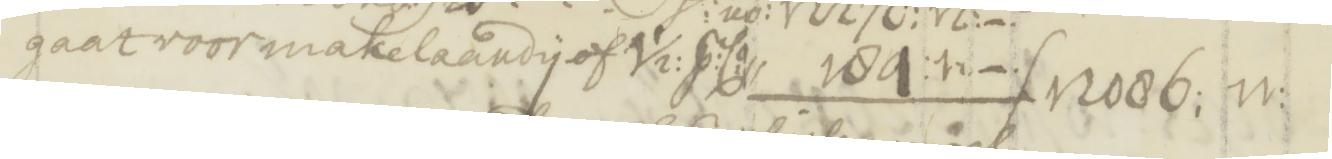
gaat voor makelaardij of 1½: p:rC:o„ 184: 12. —. ƒ 12086; 11:
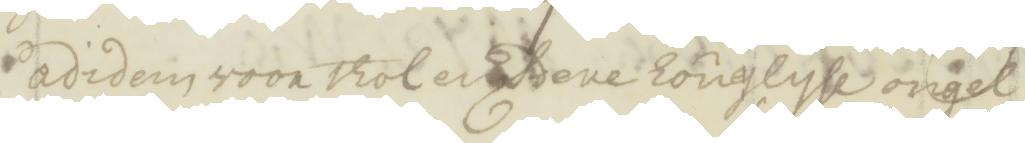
ad idem voor thol en verdere houglijse ongel
